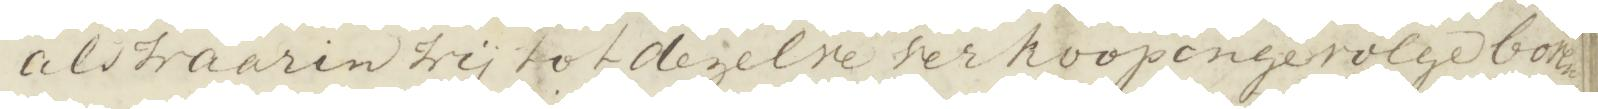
als waarin wij tot dezelve verkoopinge volge boven
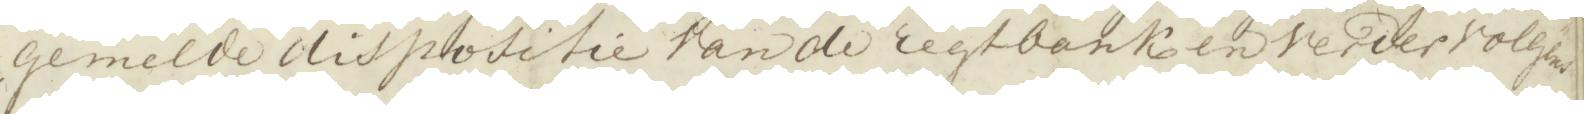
gemelde dispositie van de regtbank en verder volgens
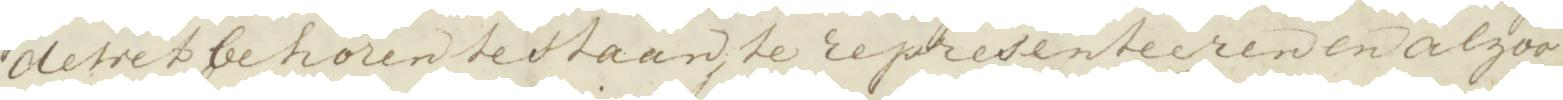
de wet behoren te staan, te representeeren en alzoo
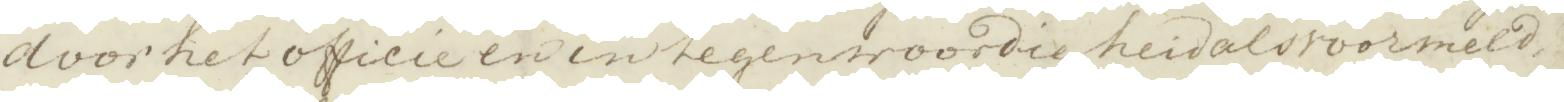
door het officie en in tegenwoordigheid als voormeld,
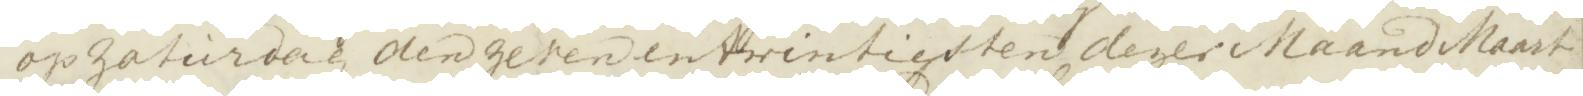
op zaturdag den zeven en twintigsten dezer Maand Maart
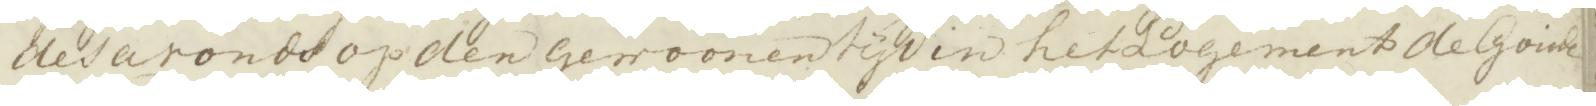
des avonds op den gewoonen tijd in het Logement de Goude
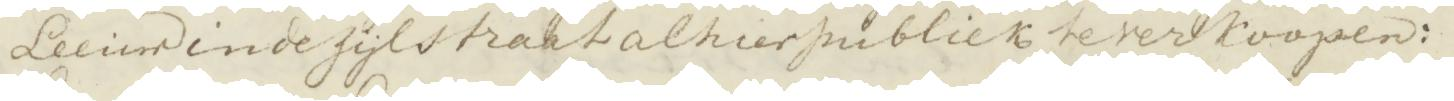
Leeuw in de zijlstraat alhier publiek te verkoopen:
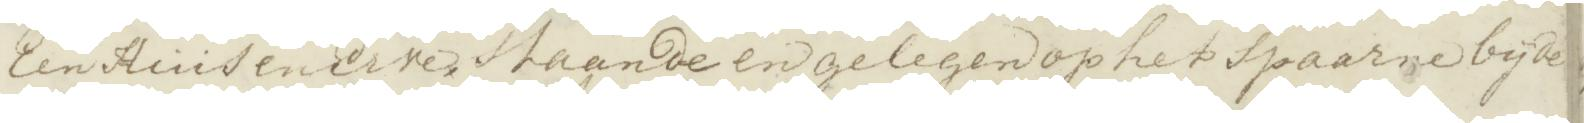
Een Huis en Erve, staande en gelegen op het spaarne bij de
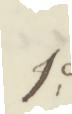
1:o
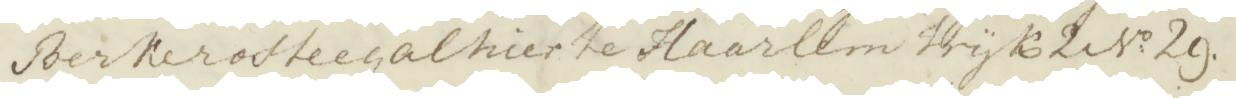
Berkerosteeg alhier te Haarlem Wijk 2 N=o 29.
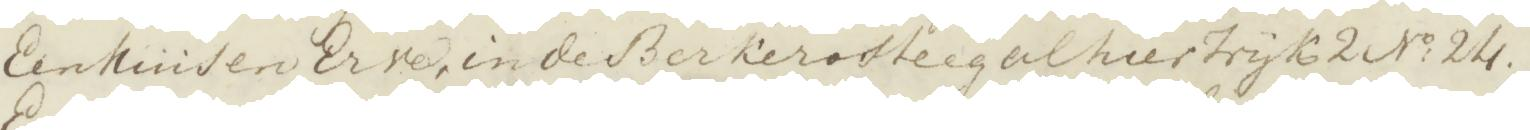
Een Huis en Erve, in de Berkerosteeg alhier wijk 2 N:o 24.
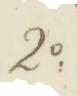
2:o
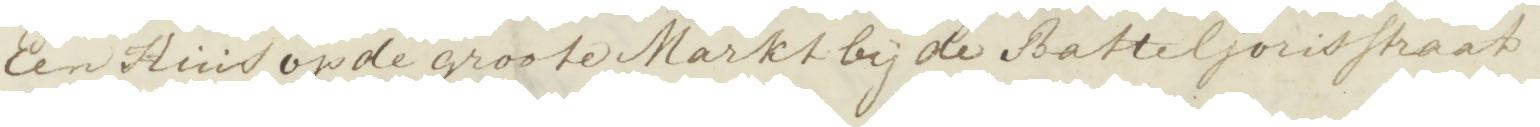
Een Huis op de groote Markt bij de Batteljorisstraat
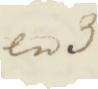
En 3o
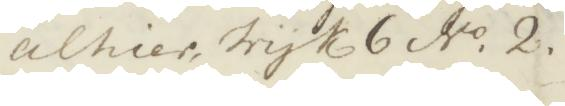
alhier, wijk 6 N=o 2.
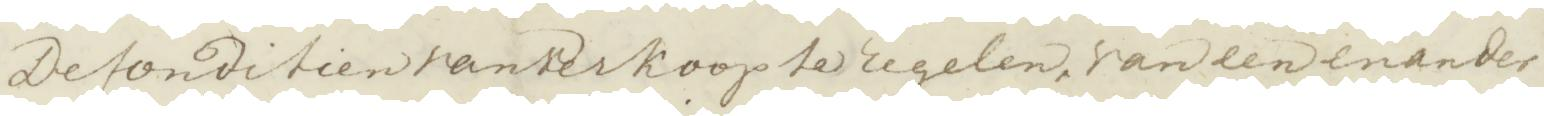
De conditien van verkoop te regelen, van een en ander
